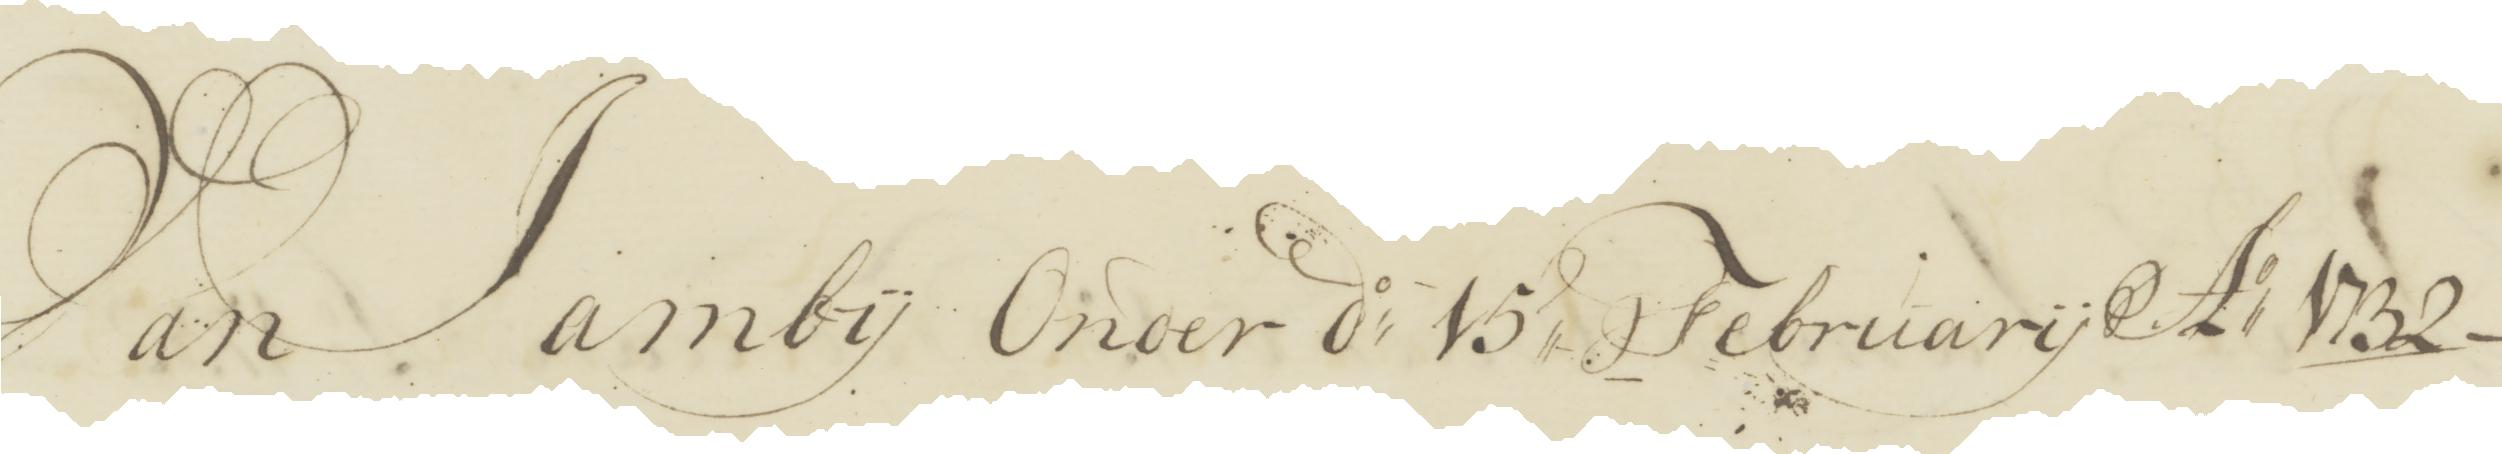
Van Jambij Onder d„o 15„' Februarij A„o 1732 –
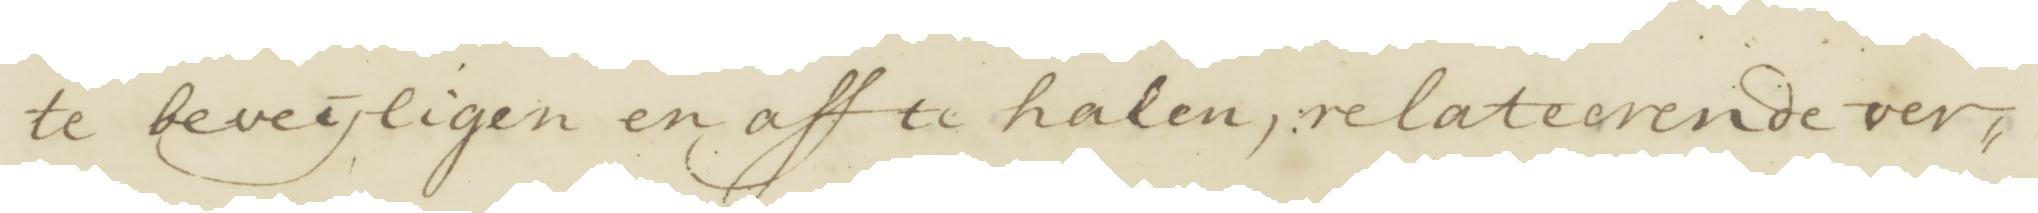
te beveijligen en aff te halen, relateerende ver„
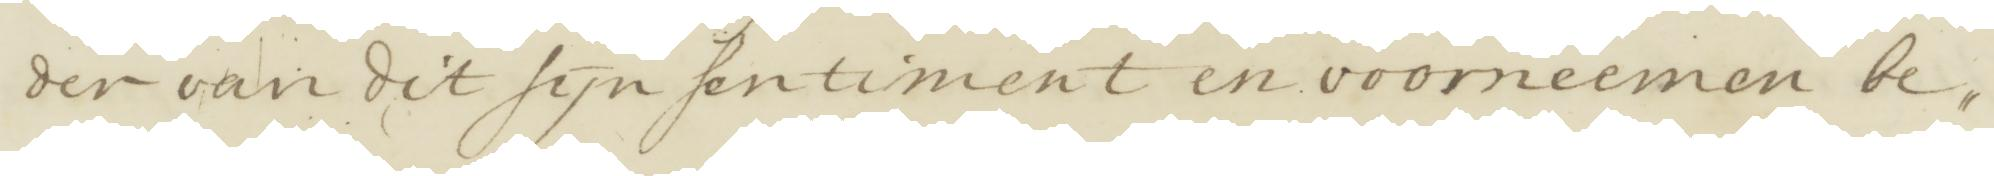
der van dit sijn sentiment en voorneemen be„
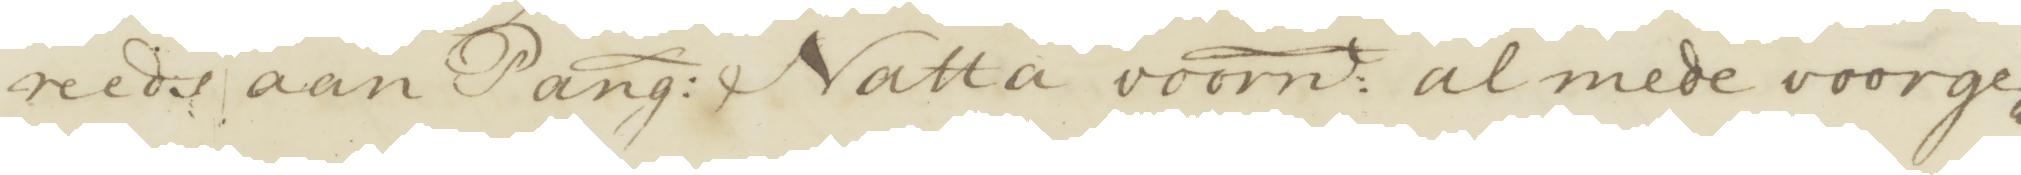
reeds aan Pang: Natta voorn: al mede voorge„
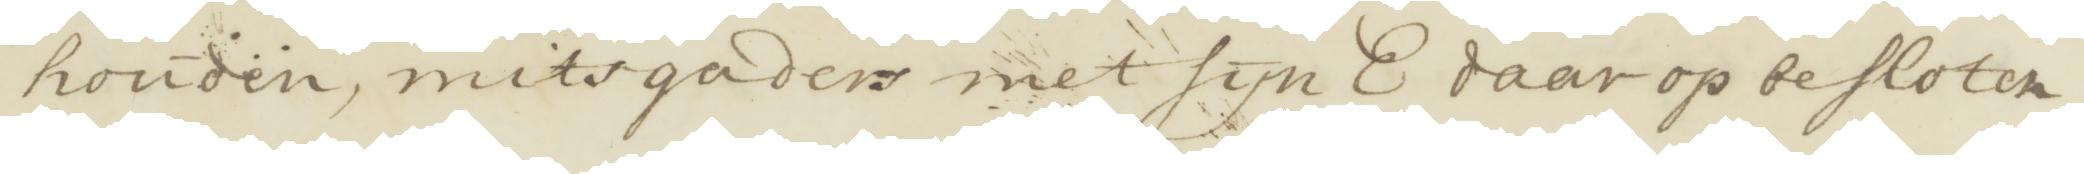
houden, mitsgaders met sijn E daar op besloten
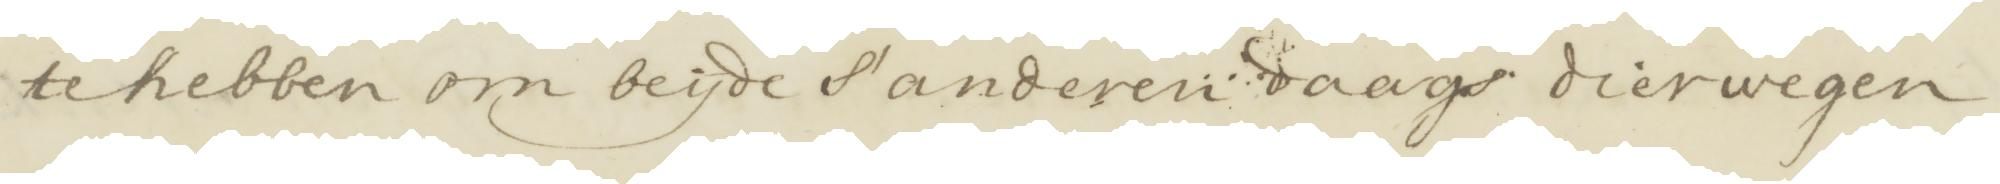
te hebben om beijde s' anderen daags dierwegen
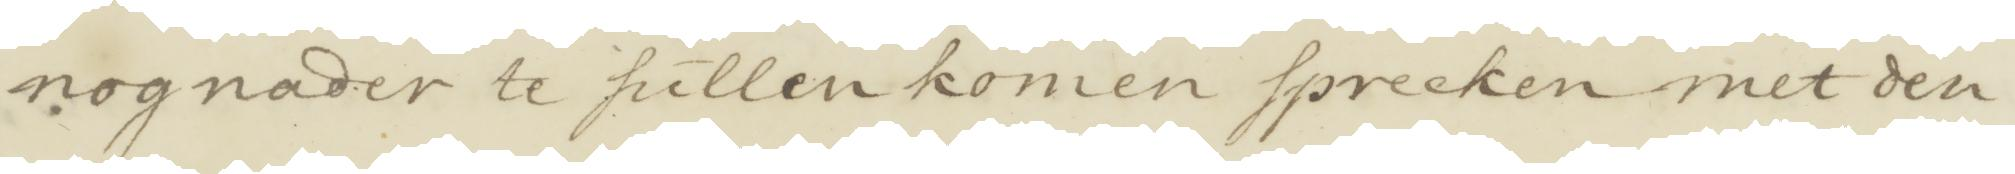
nog nader te sullen komen spreeken met den
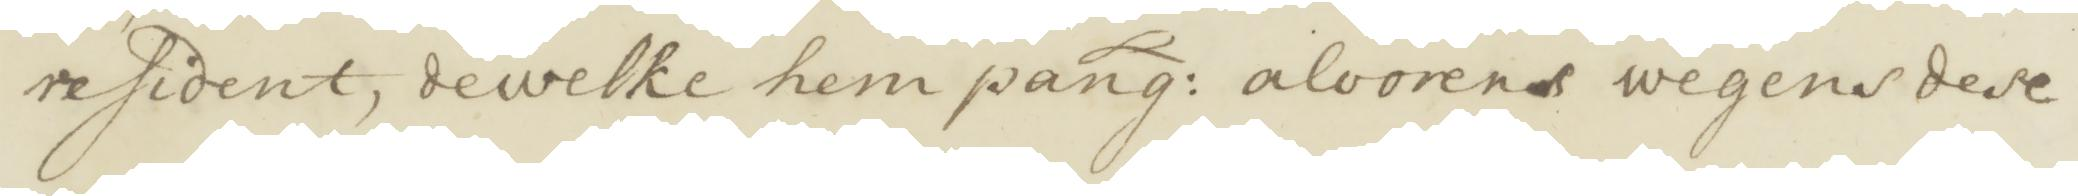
resident, dewelke hem pang: alvorens wegens dese
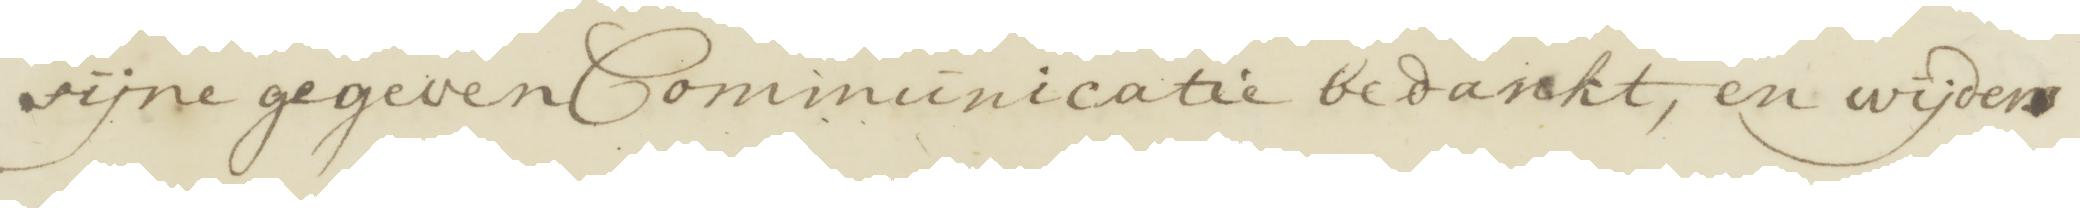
sijne gegeven communicatie bedankt, en wijders
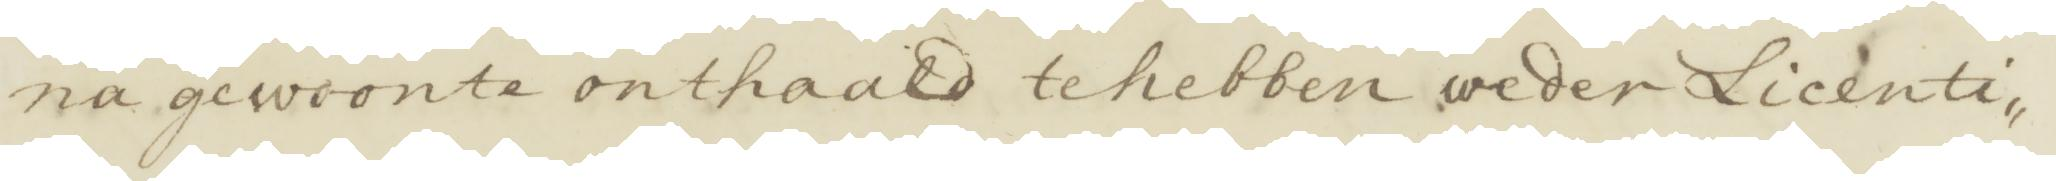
na gewoonte onthaald te hebben weder licenti„
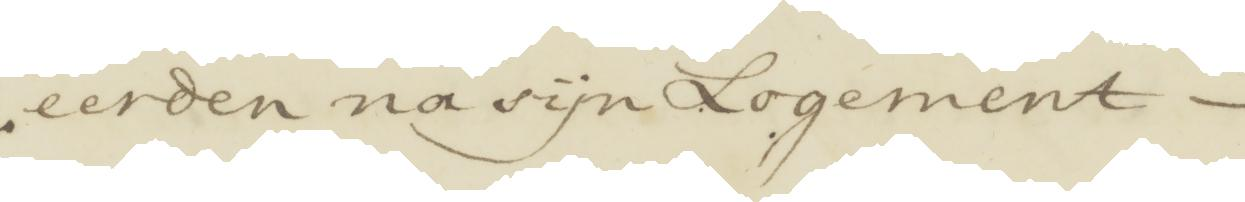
„eerden na sijn logement
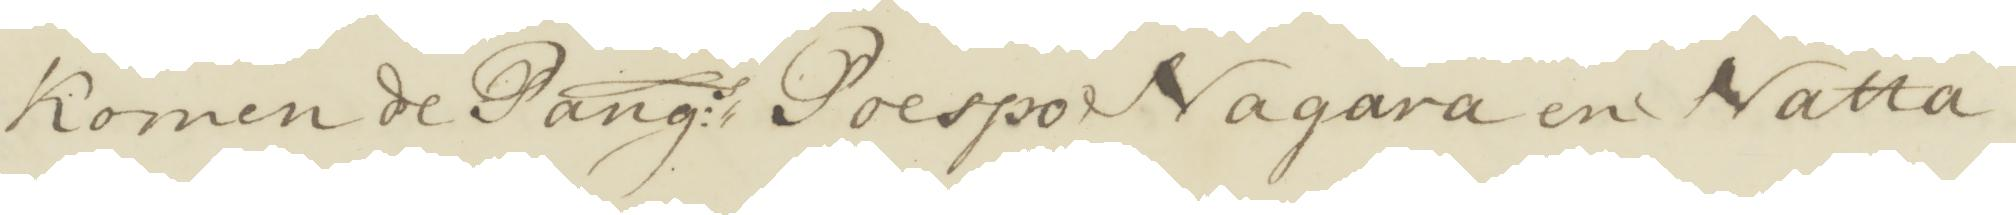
Komen de Pang:„s Poespo Nagara en Natta
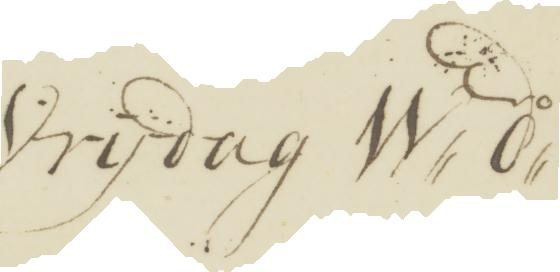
Vrijdag 11„' d„o
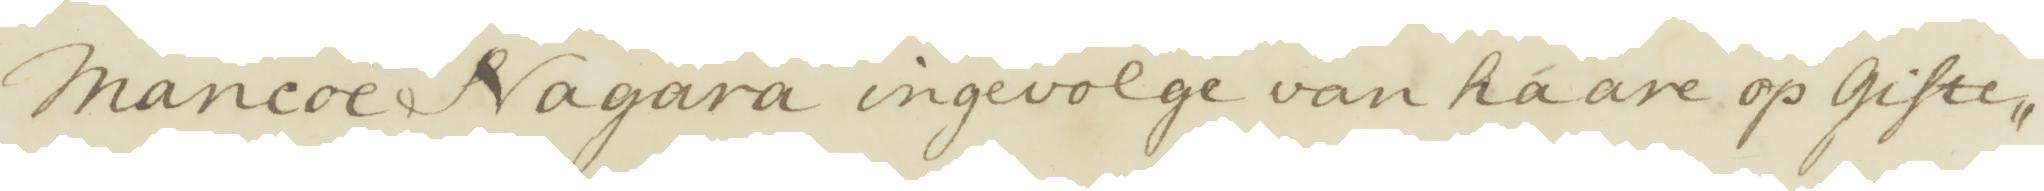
Mancoe Nagara ingevolge van haare op giste„
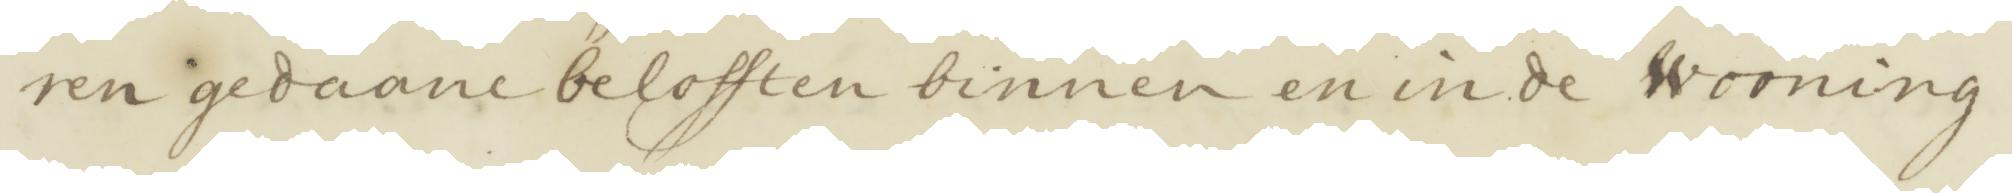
ren gedaane belofften binnen en in de wooning
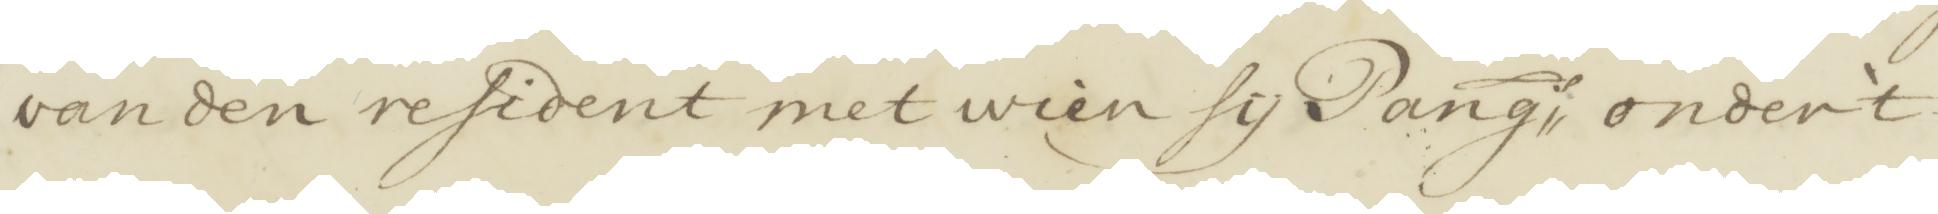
van den resident met wien sij Pang„s onder ’t
